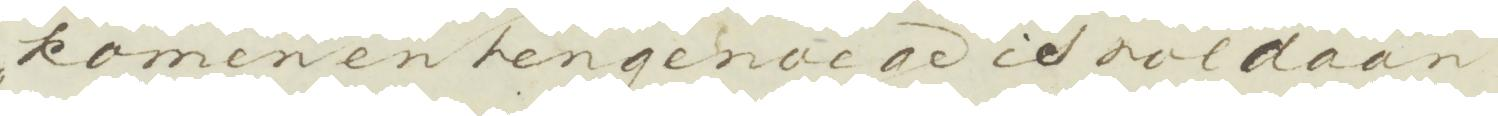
„komen en ten genoege is voldaan
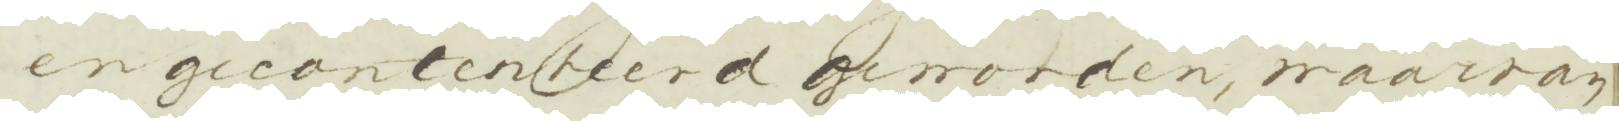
en gecontenteerd geworden, waarvan
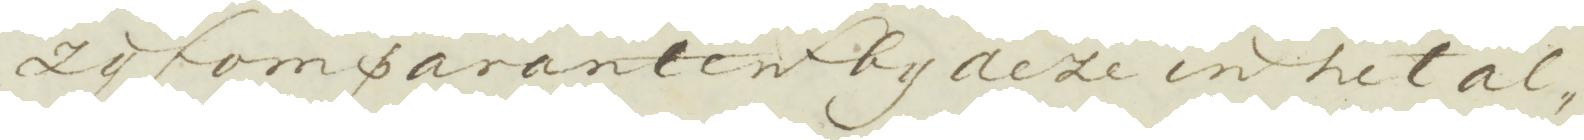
zy Comparanten by deze in het al„
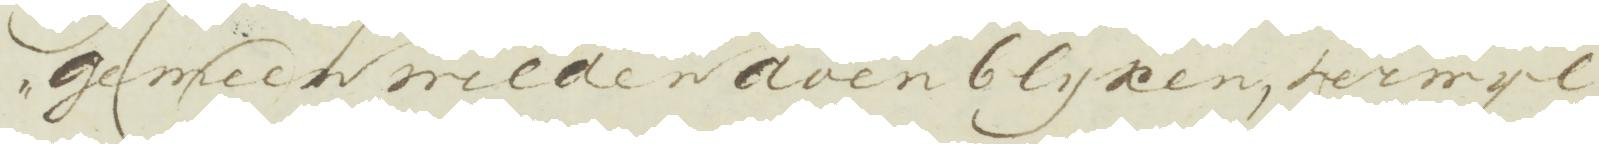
„gemeen wilden doen blyken, terwyl
